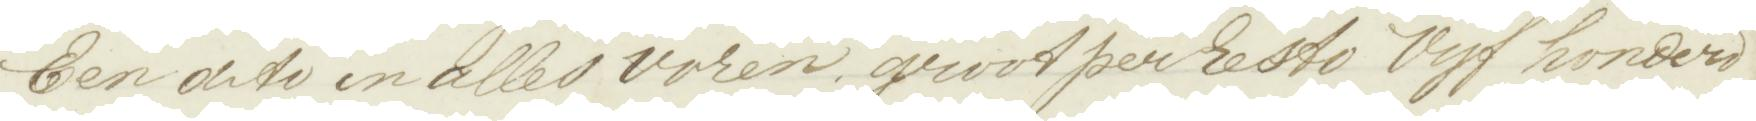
Een dito in alles voren, groot per resto vyf honderd
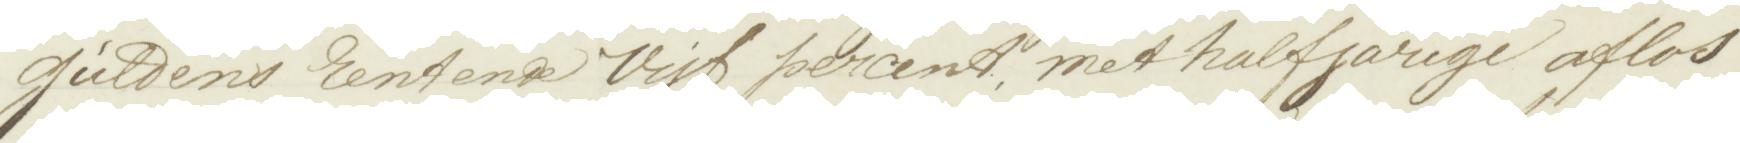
Guldens rentende vijf percent, met halfjarige aflos
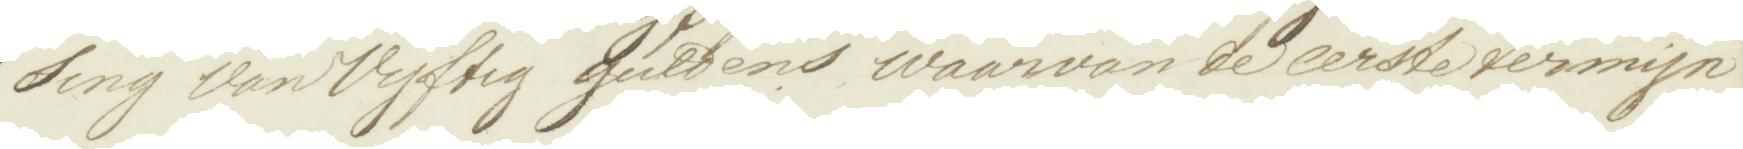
sing van Vyftig guldens waarvan de eerste termijn
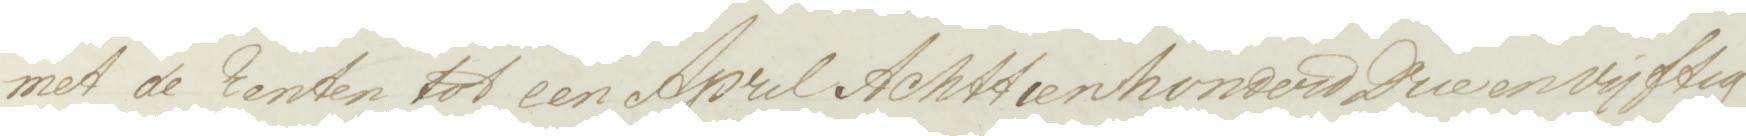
met de renten tot een April Achttienhonderd Drie en vijftig
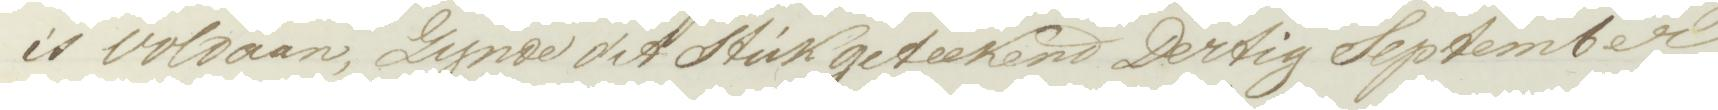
is voldaan, zynde dit stuk geteekend Dertig September
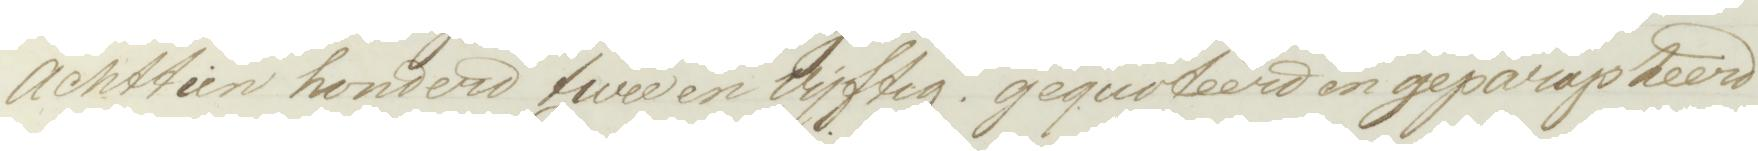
achttien honderd twee en Vijftig. gequoteerd en geparapheerd
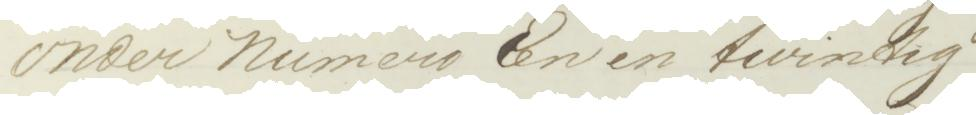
onder Numero Een en twintig
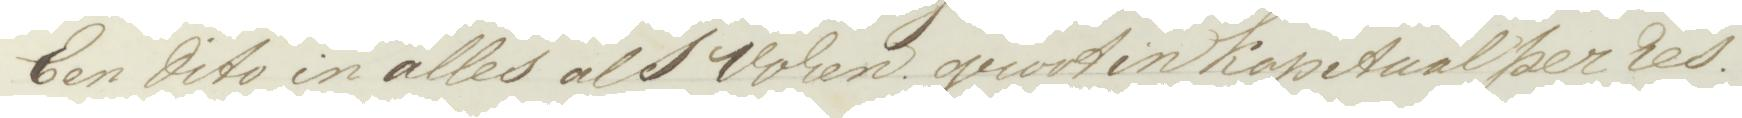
Een dito in alles als voren. groot in kapitaal per res.
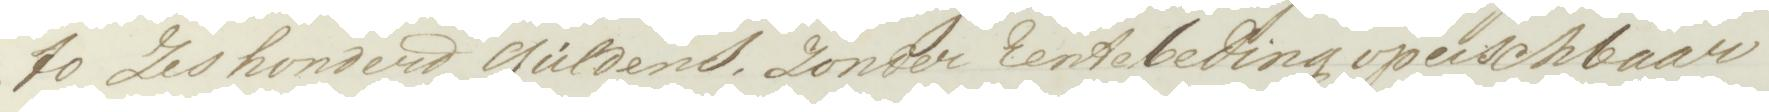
to zes honderd guldens, zonder Rentebeding opeischbaar
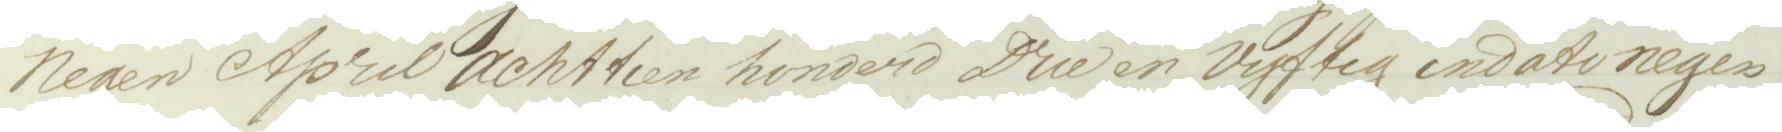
negen April achttien honderd Drie en vyftig in dato negen
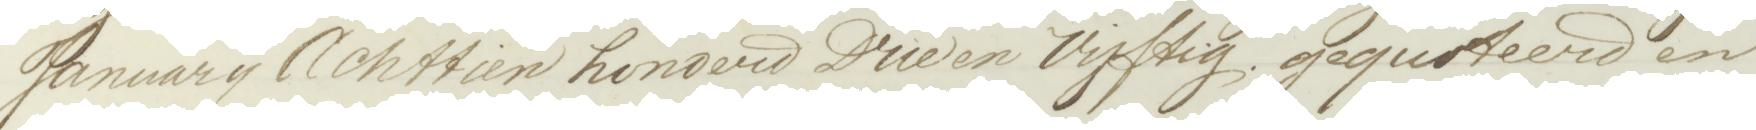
Januarij Achttien honderd Drie en Vijftig, gequoteerd en
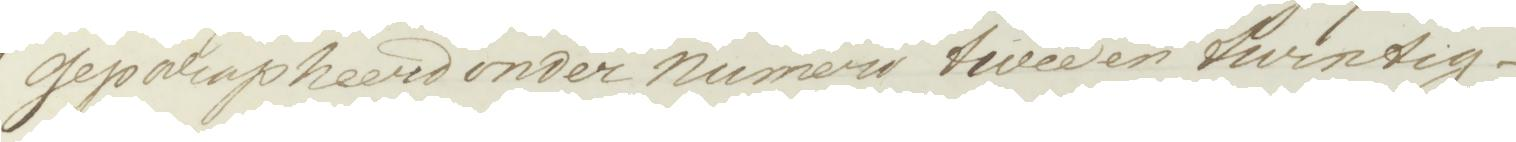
geparapheerd onder numero twee en twintig.
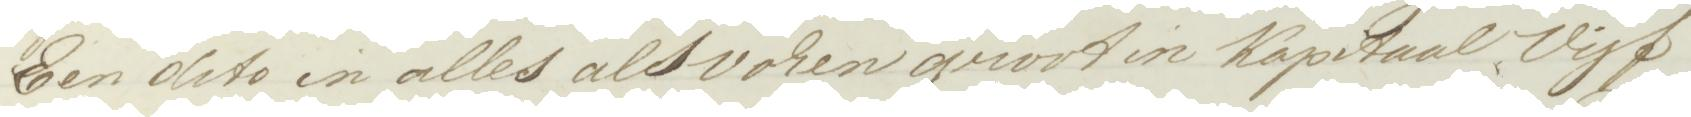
Een dito in alles als voren groot in Kapitaal Vijf
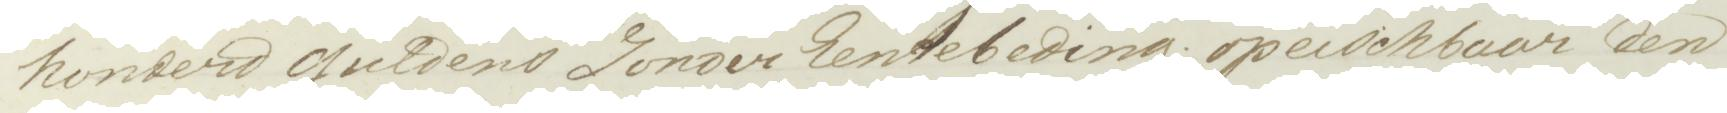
honderd guldens zonder Rentebeding. opeischbaar den
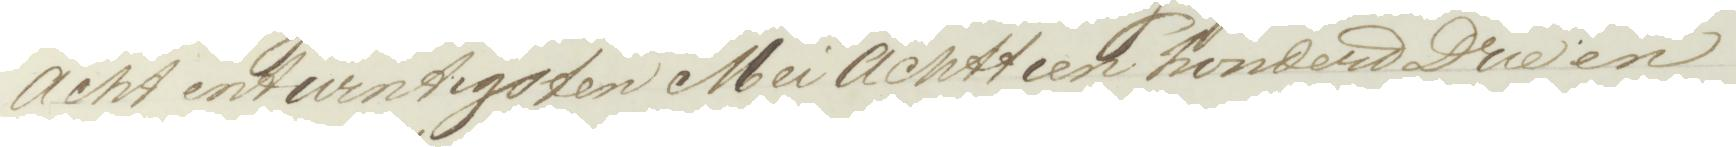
acht entwintigsten Mei Achttien honderd Drie en
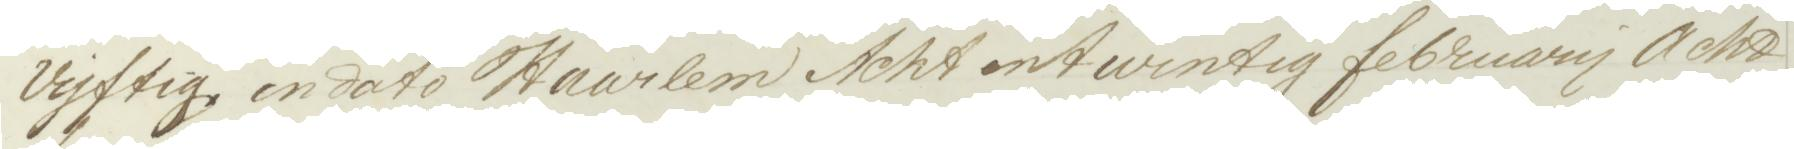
Vijftig in dato Haarlem Acht entwintig februarij Acht
